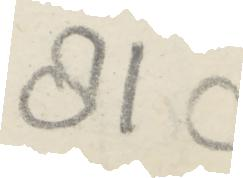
819
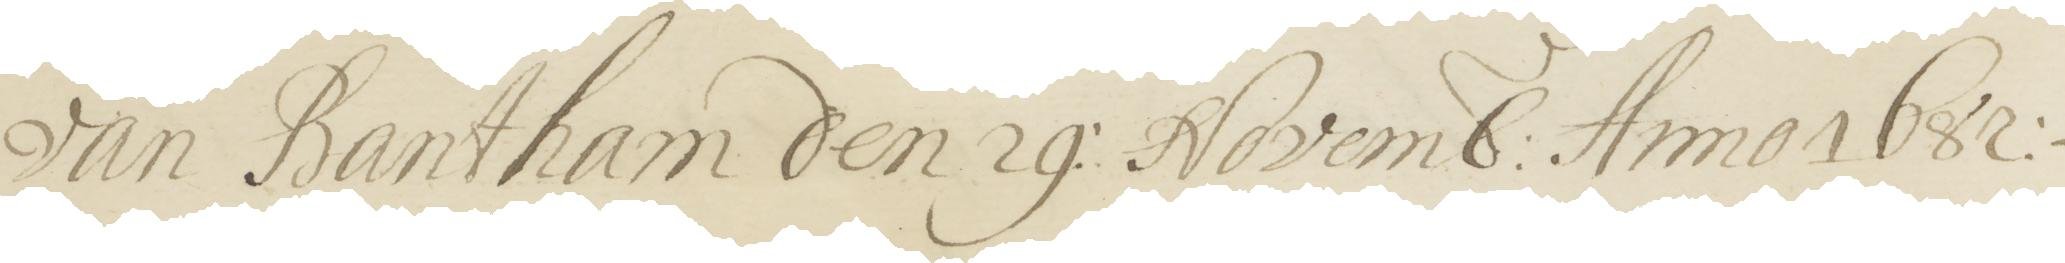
Van Bantham den 29: Novemb: Anno 1682:—
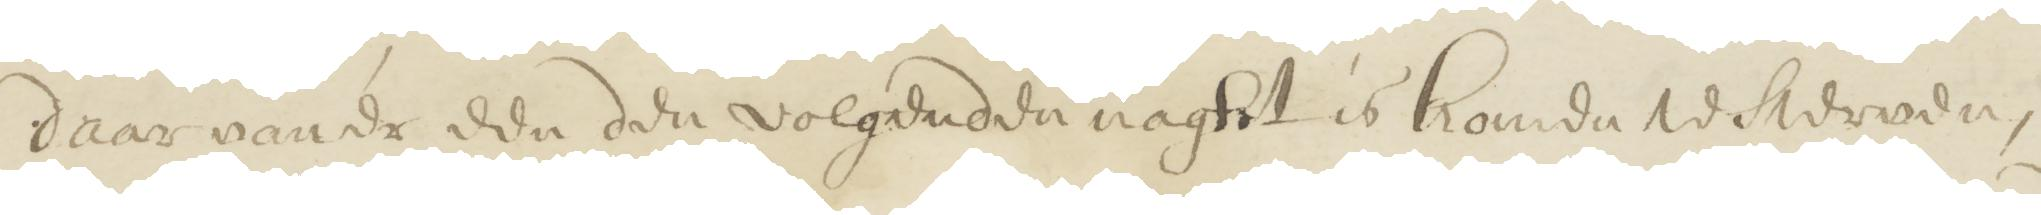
daar van 'er een den volgenden naght is komen te sterven,
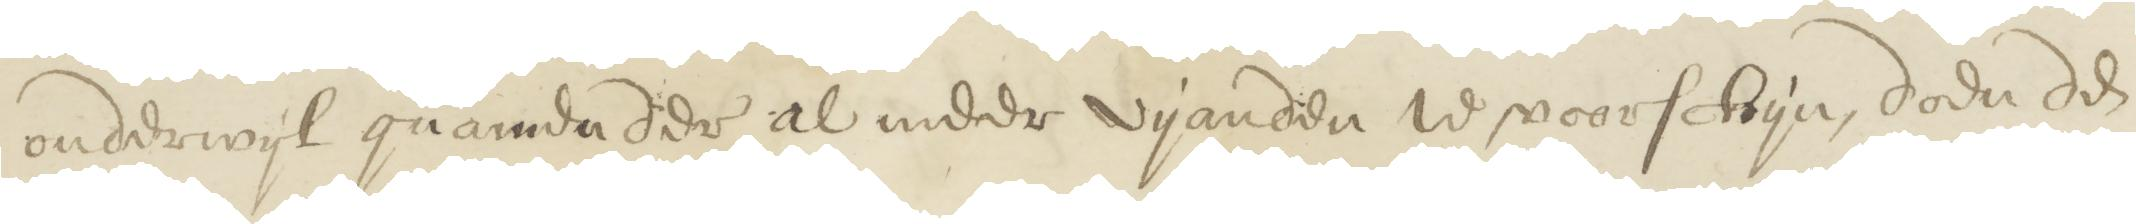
onderwijl quamen der al meer vijanden te voorschijn, doen den
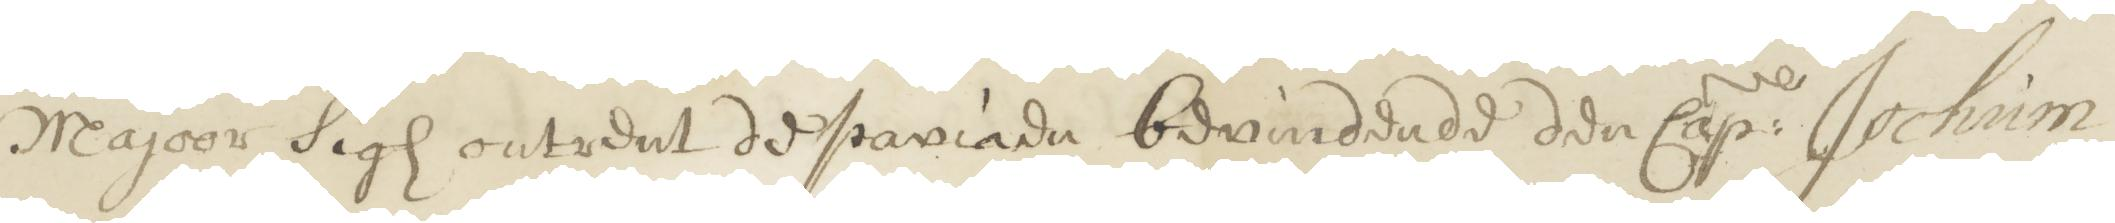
Majoor sigh ontrent de paviaen bevindende den Cap:ne Jochum
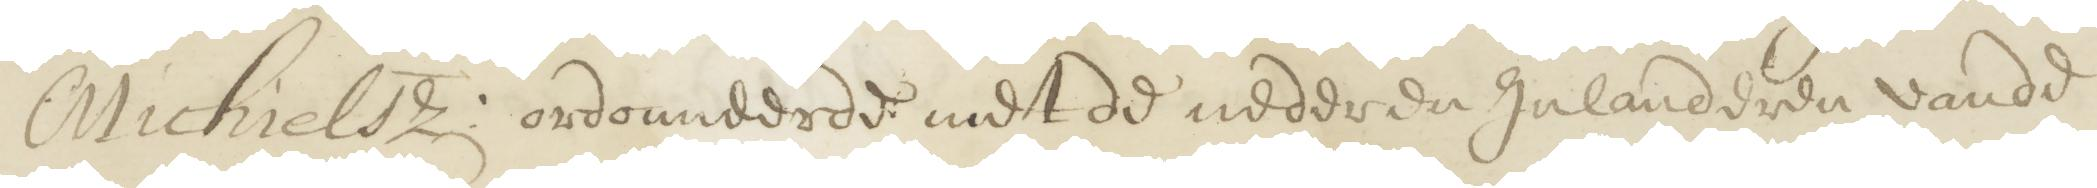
Michielsz: ordonneerde met de nederen Inlanderen vande
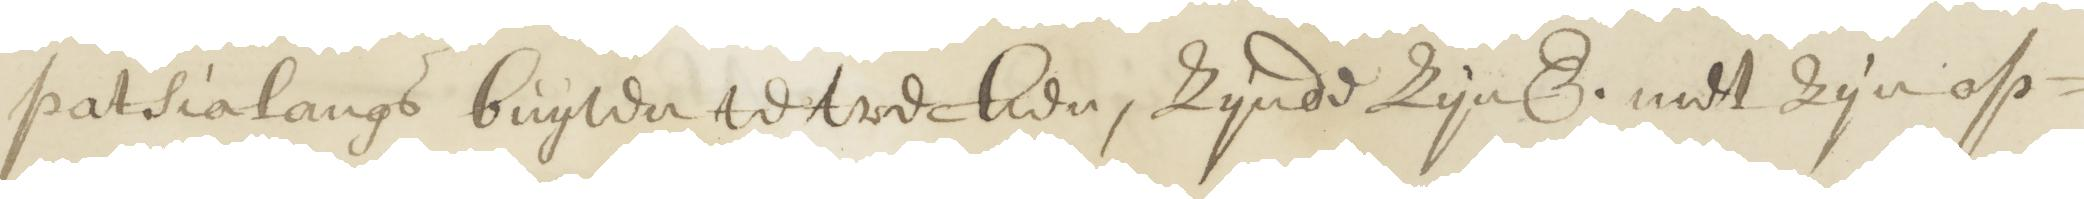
patsialangs buijten te trecken, zijnde zijn E. met zijn op=
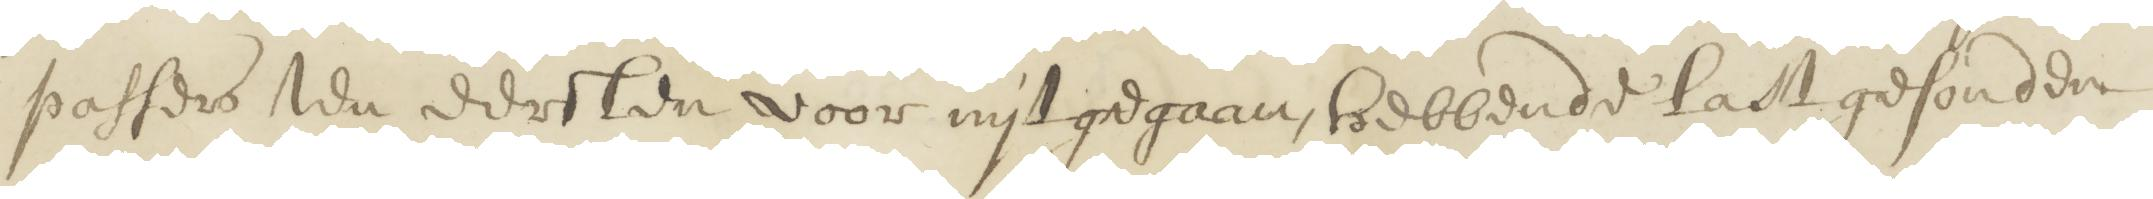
passers ten eersten voor uijtgegaan, hebbende last gesonden
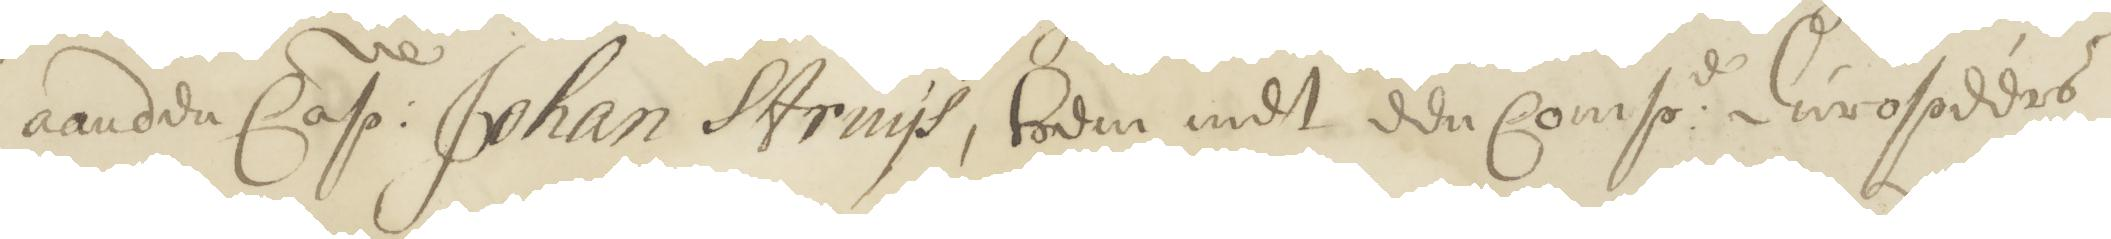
aan den Cap:ne Johan Struijs, hem met een Comp:e Europeers
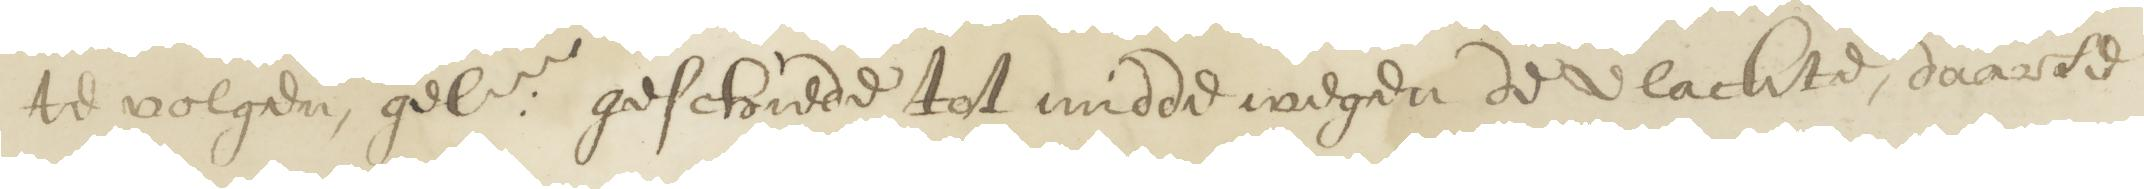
te volgen, gel: geschiede tot midde wegen de vlackte, daarse
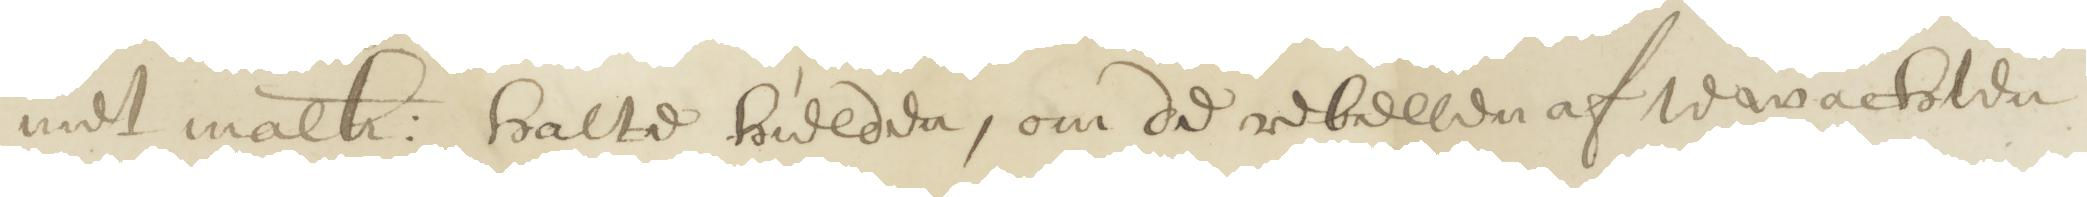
met malk: halte hielden, om de rebellen af tewachten
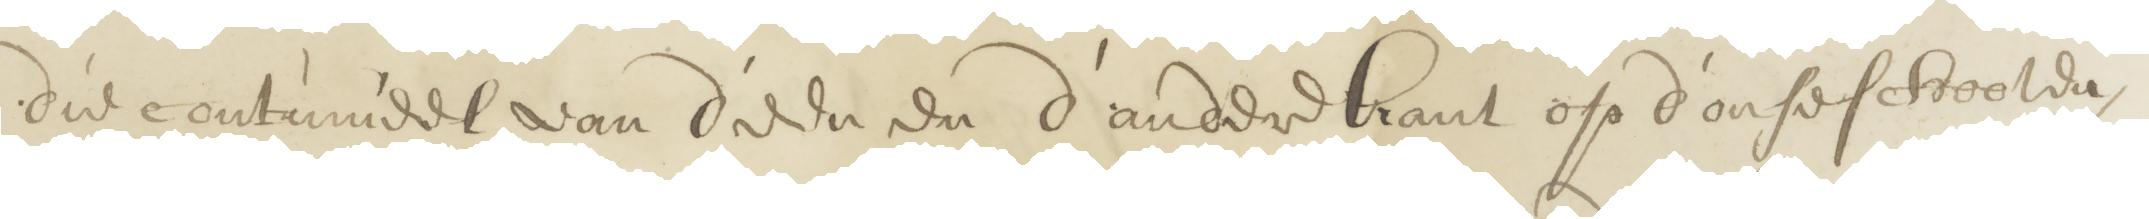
die continueel van d'een en d’andere kant op d’onse schooten,
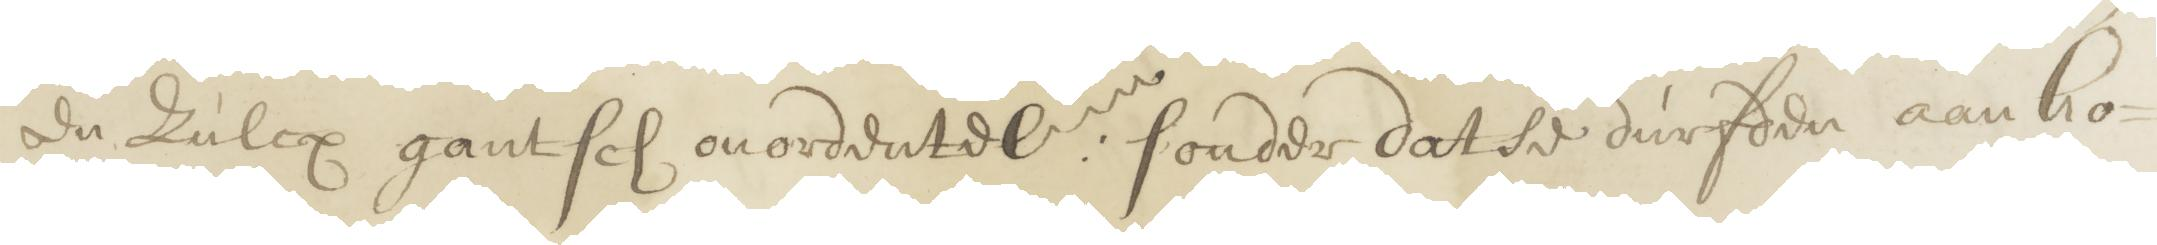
en zulcx gantsch onordentel: sonder datse durfden aanko=
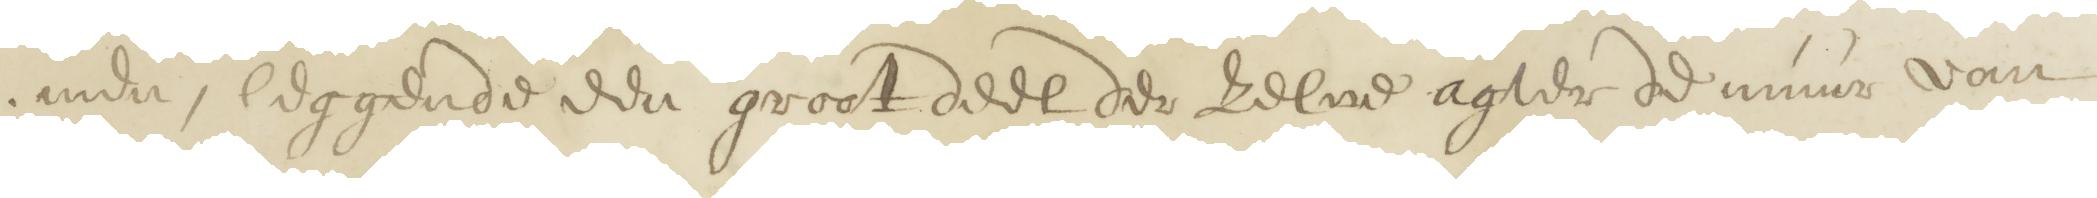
. men, leggende een groot deel der zelve agter de muur van
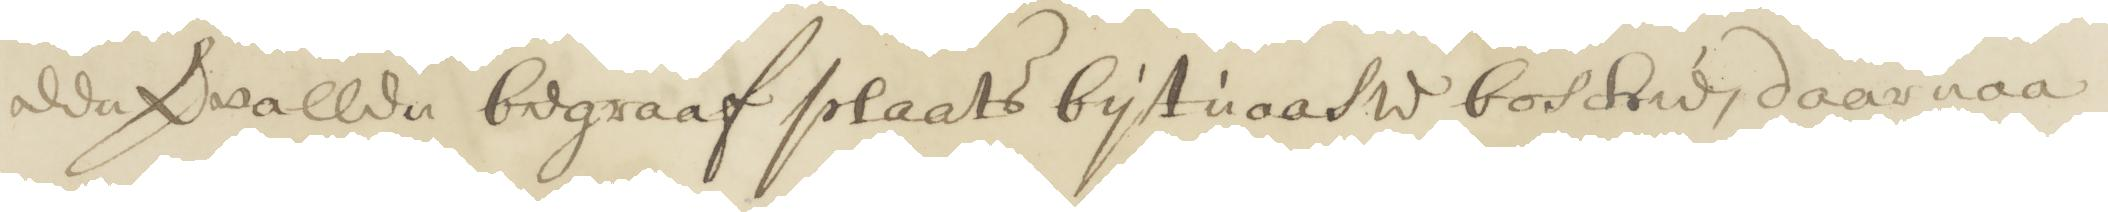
een vervallen begraaf plaats bijtuaaste boschie, daarnaa
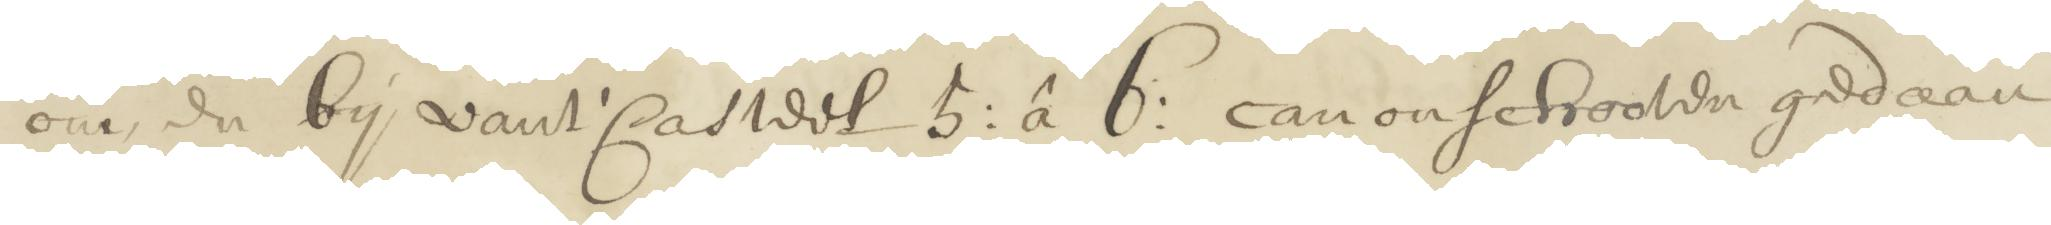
om, en bij vant' Casteel 5: â 6: canonschooten gedaan
